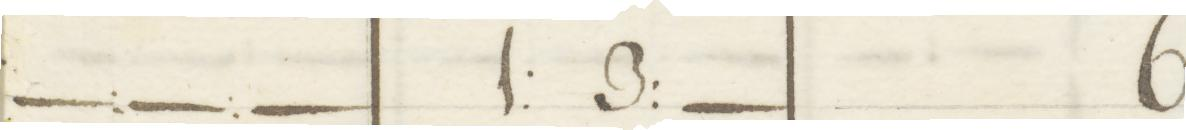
—:—:— 1: 3: — 6
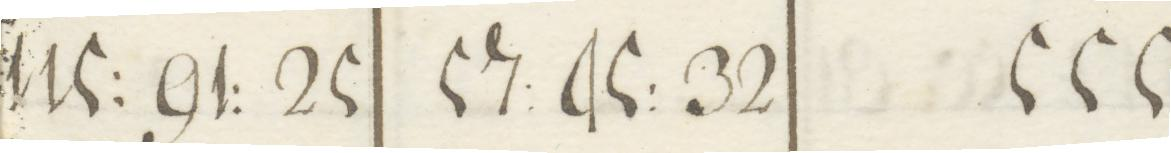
115: 91: 25 57: 45: 32 555
